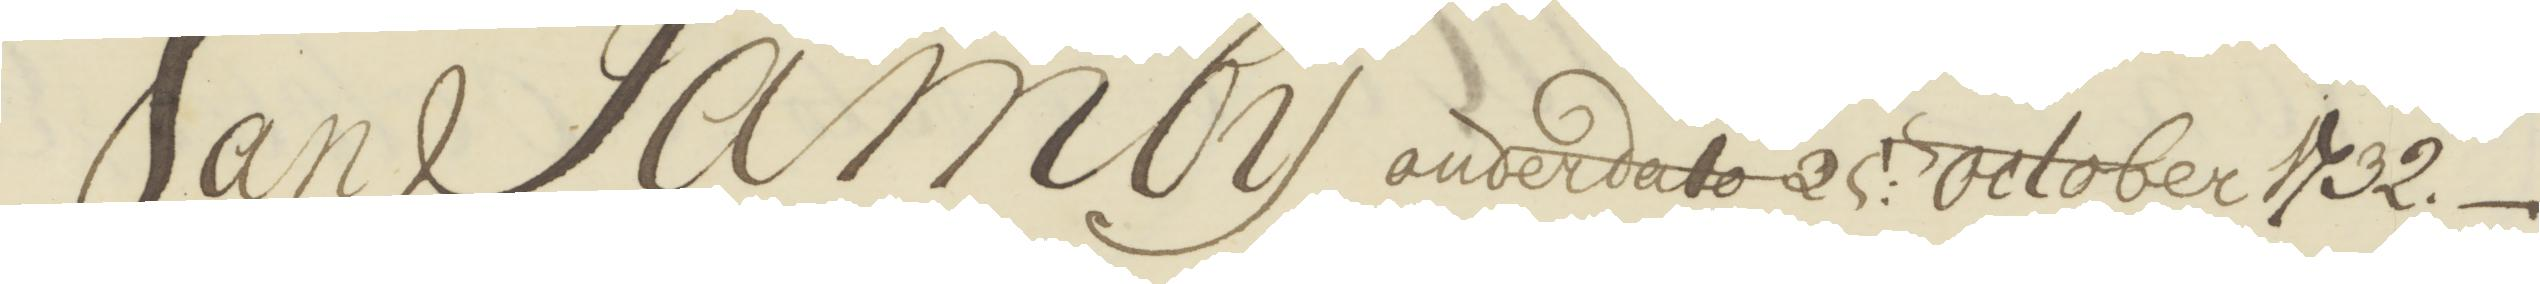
Van Jambij onderdato 25:en october 1732.–
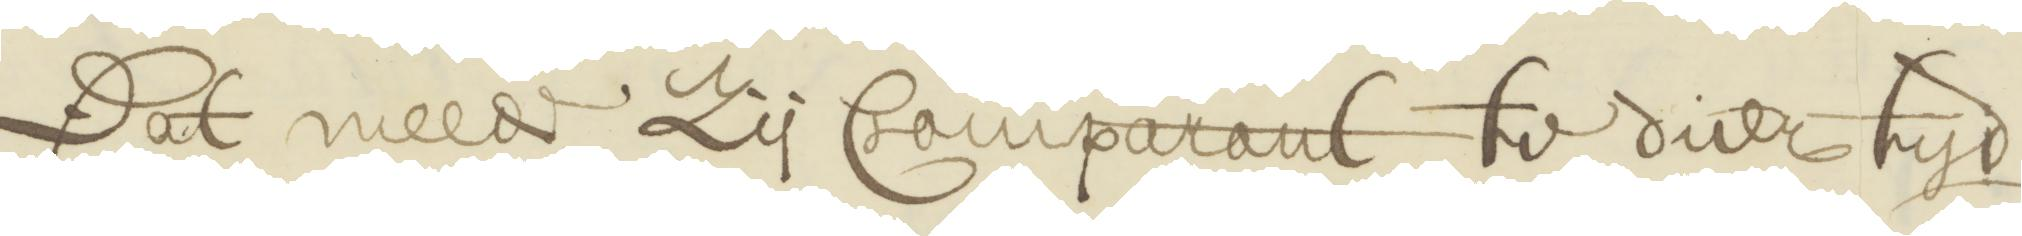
Dat meede zij Comparant te dier tijd
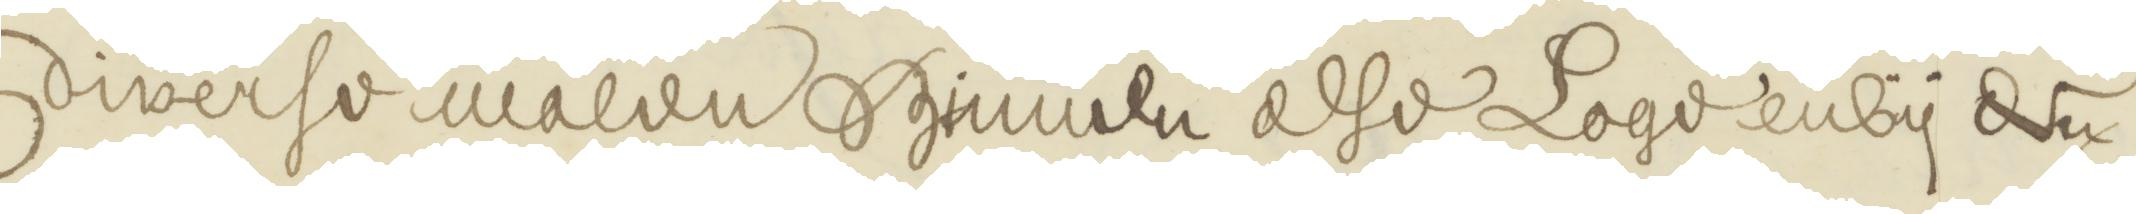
diverse malen Binnen alse Loge enbij den
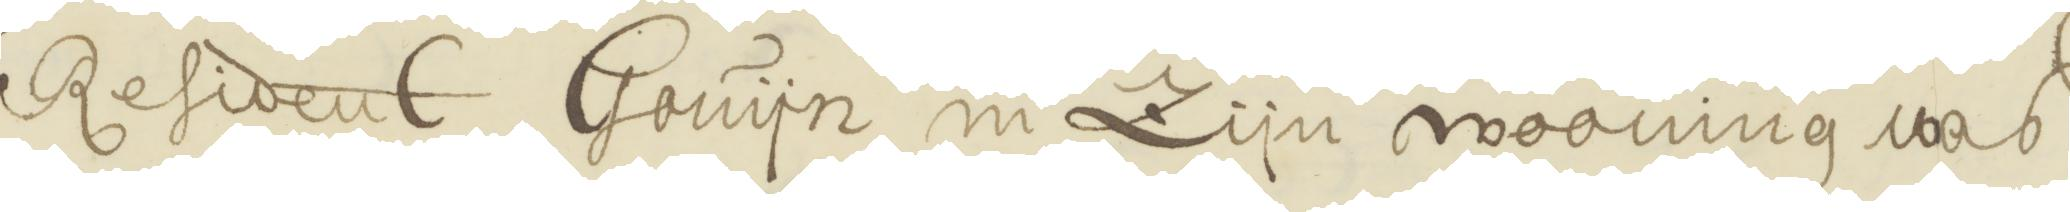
Resident Gouijn in zijn wooning was
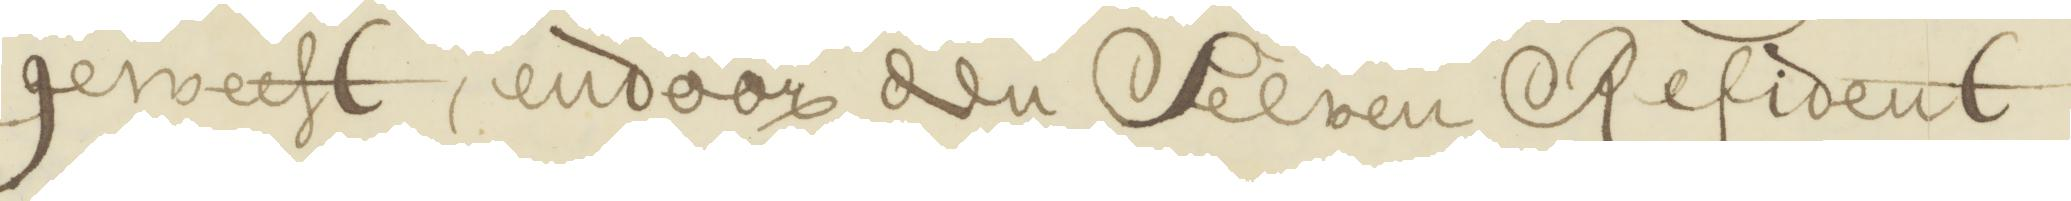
geweest, en door den selven Resident
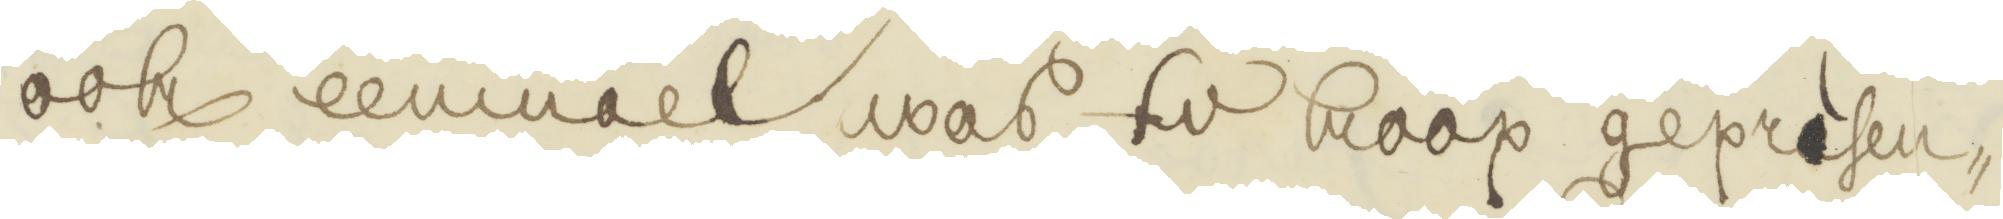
ook eenmael was te koop gepresen„
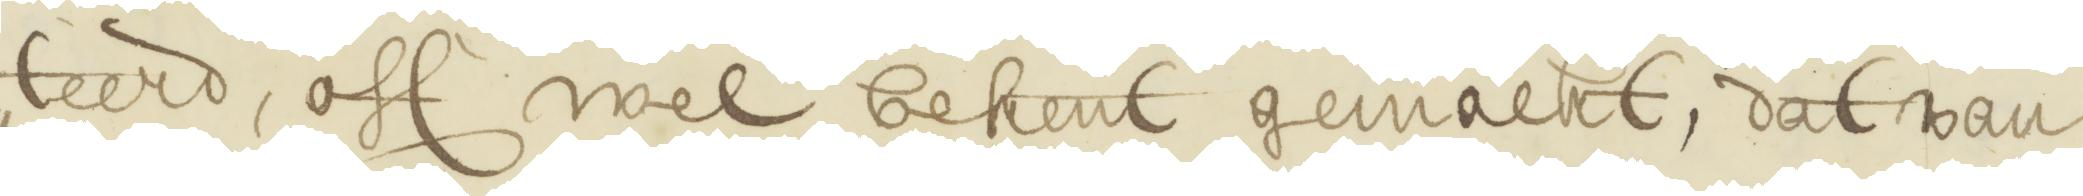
teerd, off wel bekent gemalkt, dat van
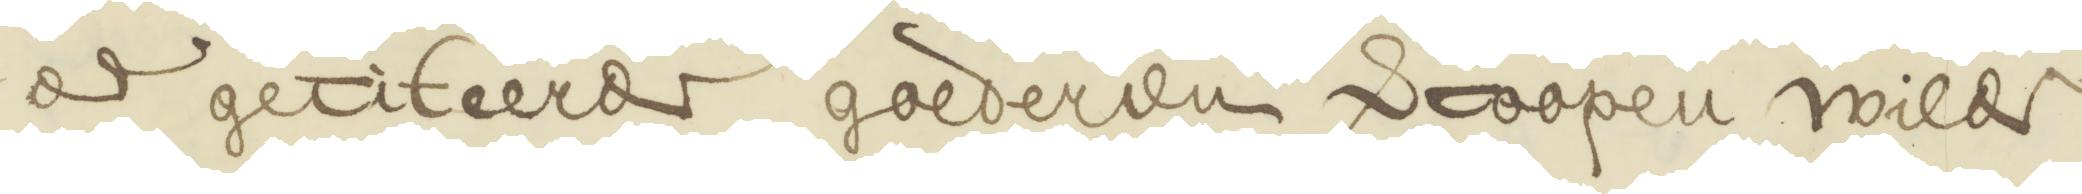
de geciteerde goederen vercoopen wilde
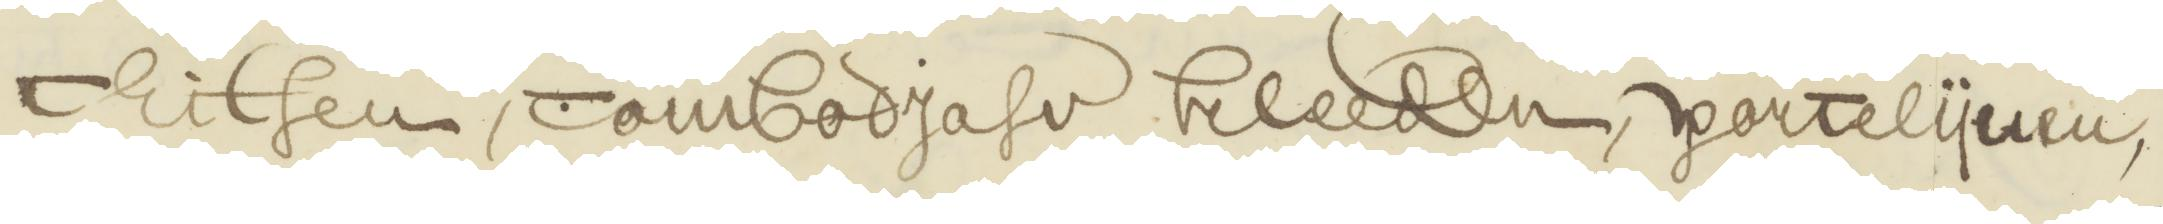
chitsen, combodjase kleeden, porcelijnen,
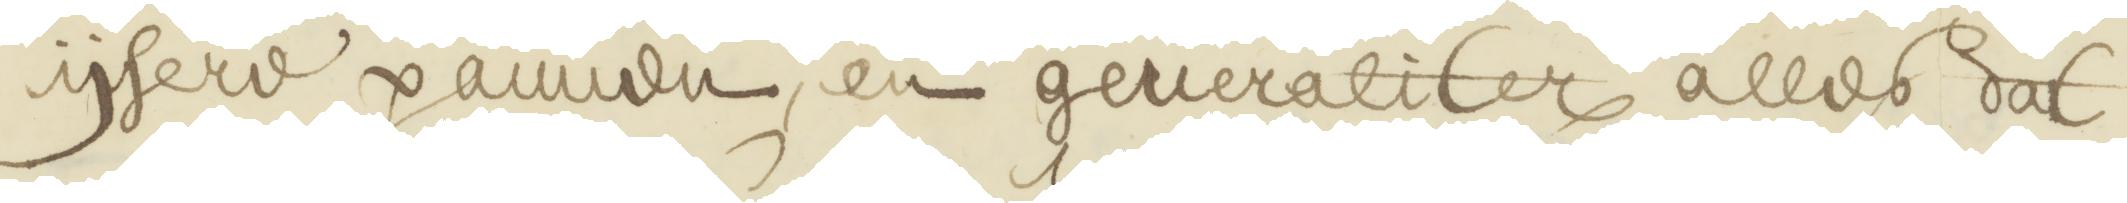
ijsere pannen, en generaliter alles dat
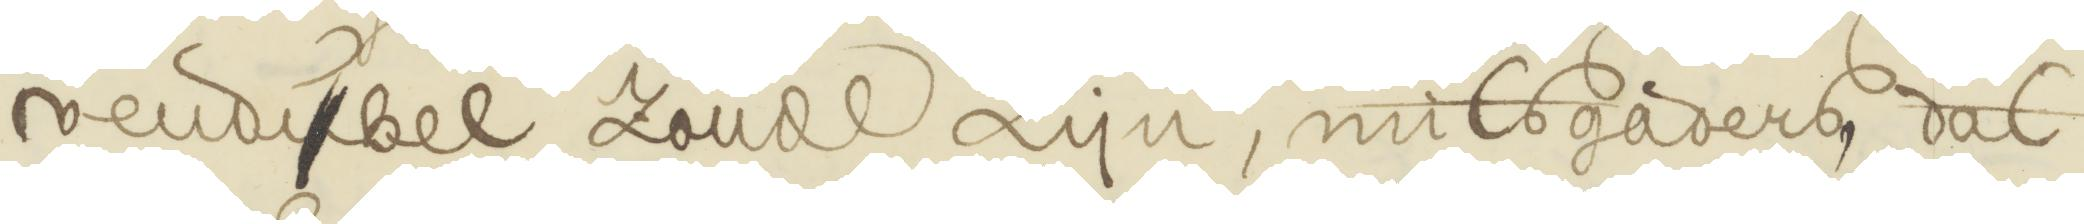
vendibel zoude zijn, mitsgaders, dat
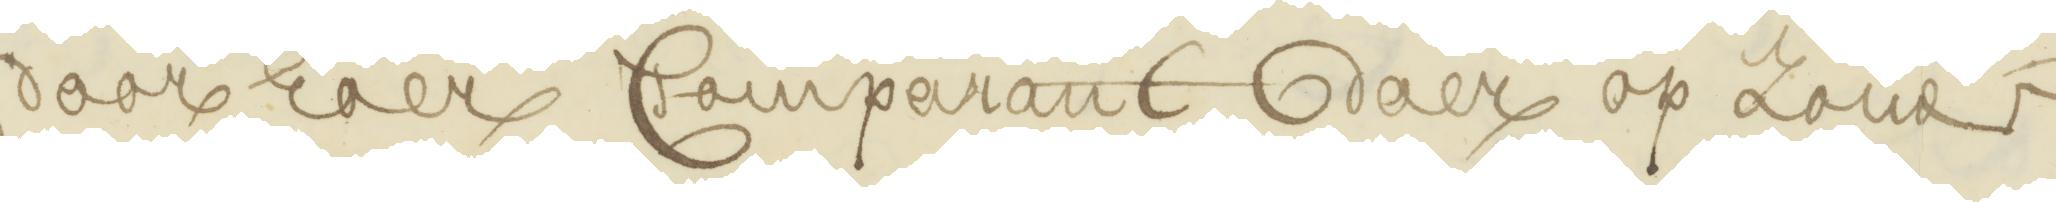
door haer Comparant daer op zoude
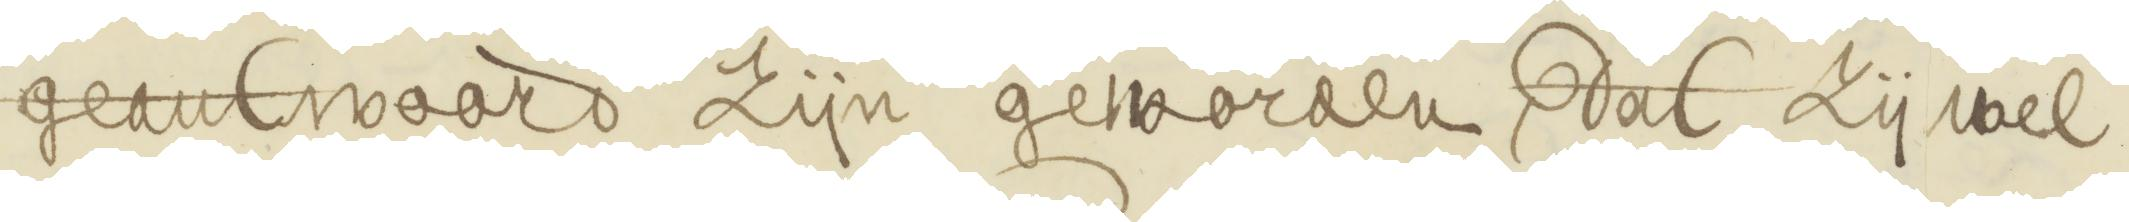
geantwoord zijn geworden dat zij wel
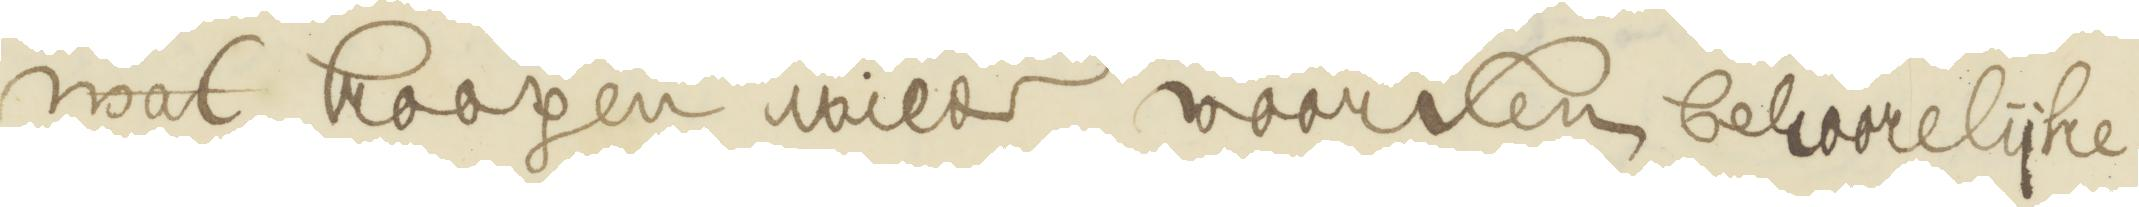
wat koopen wilde voor een behoorelijke
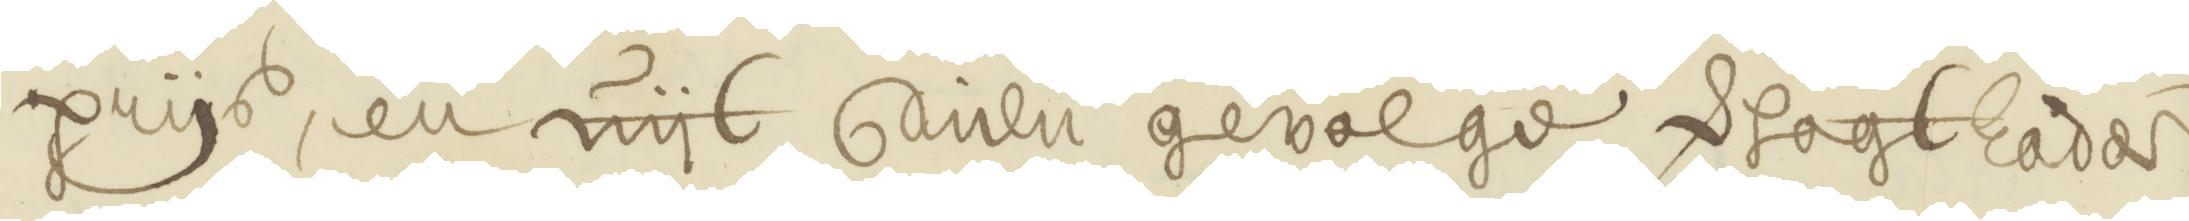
prijs, en uijt dien gevolge versogt hadde
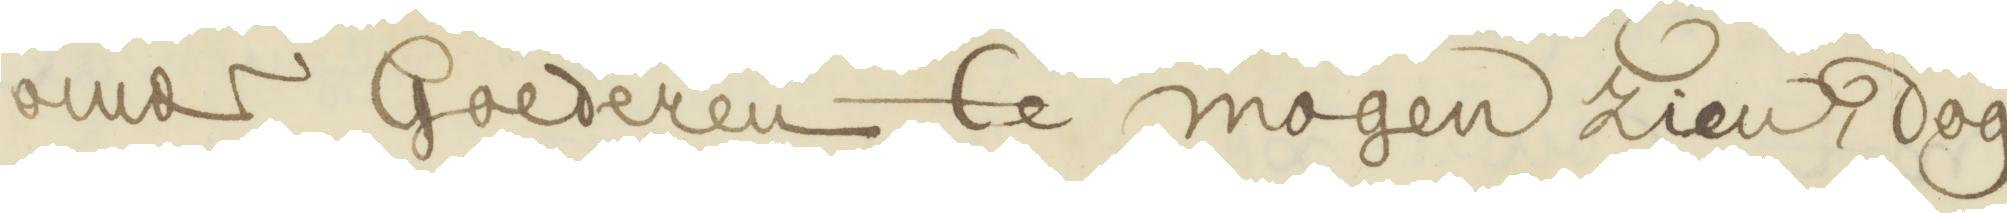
omde goederen te mogen zien, dog
